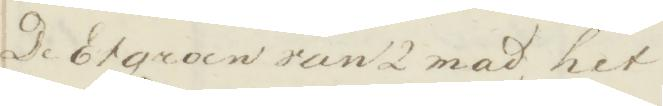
De Etgroen van 2 mad, het
